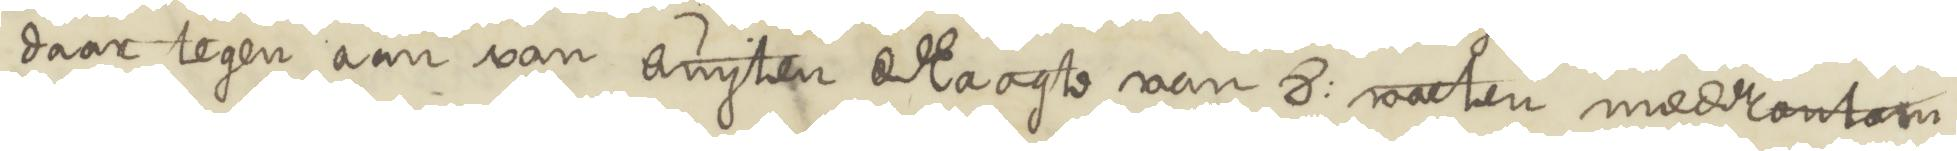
daar tegen aan van buijten dehoogte van 8: vaeten mede rontom
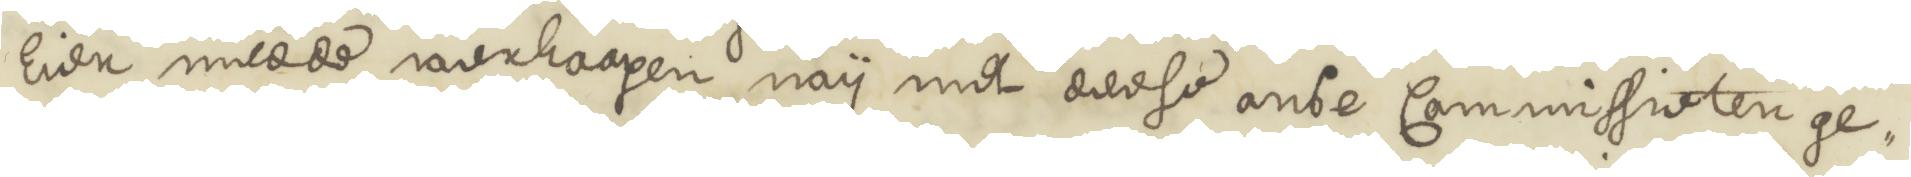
hier medde verhoopen wij met deese onse Commissieten ge„
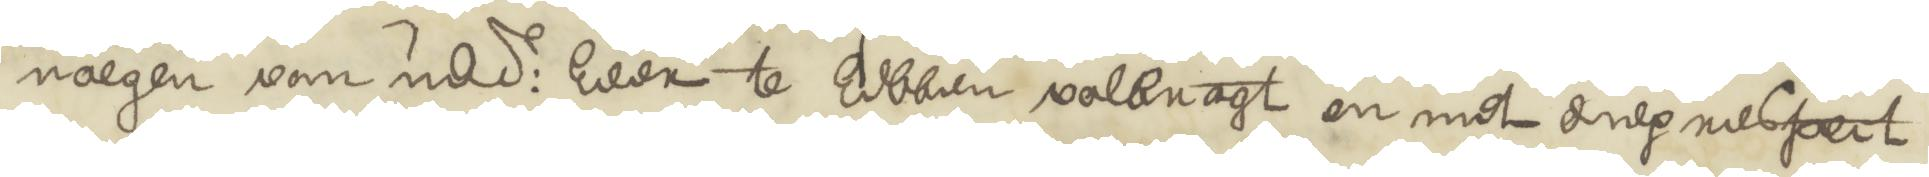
noegen van uEd: heer te hebben volbragt en met diep respect
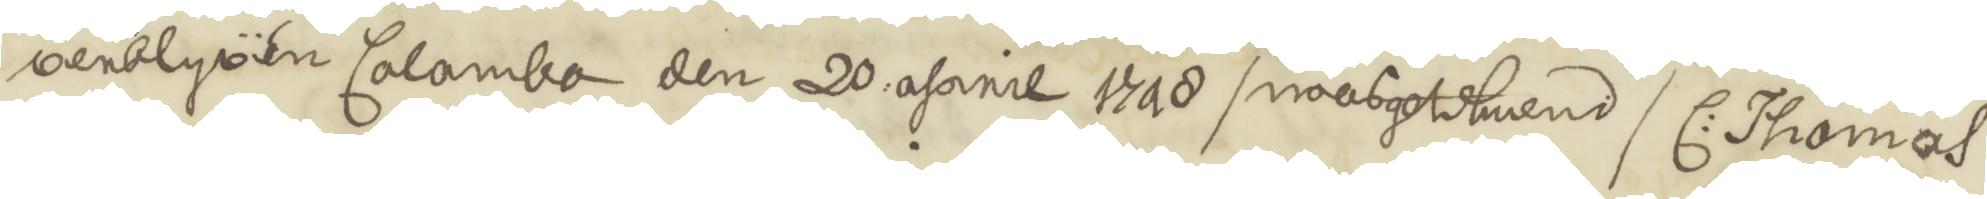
verblijven Colombo den 20: april 1748 / wasgetekend / C: Thomas
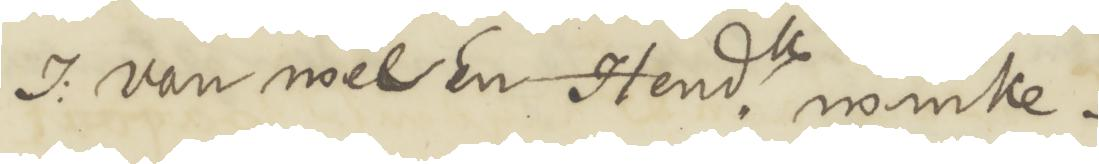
I: van wel en Hend„k winke
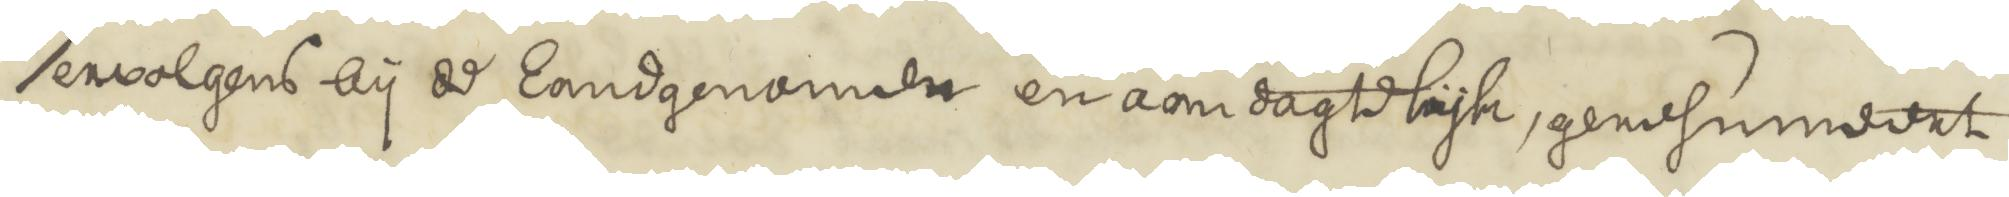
Vervolgens bij de handgenomen en aan dagtelijk, geresumeert
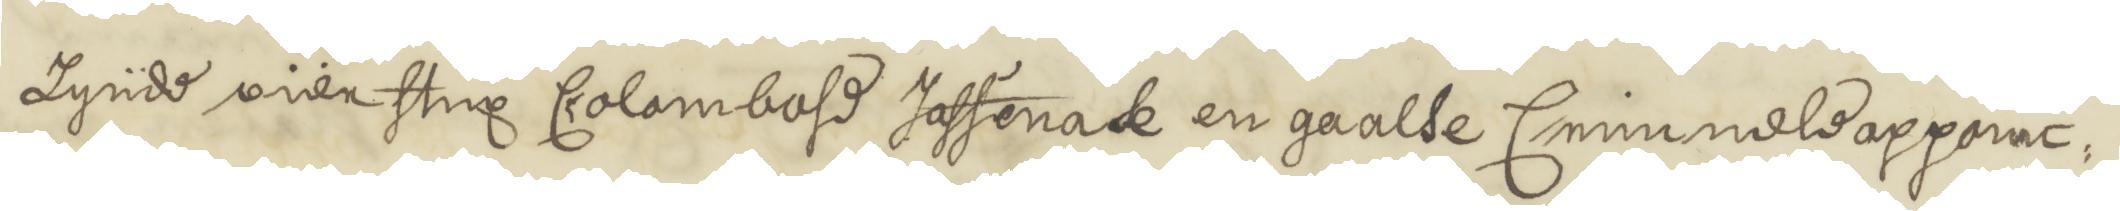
zijnde vier stux Colombose Jaffenak en gaalse Crimnele appoinc„
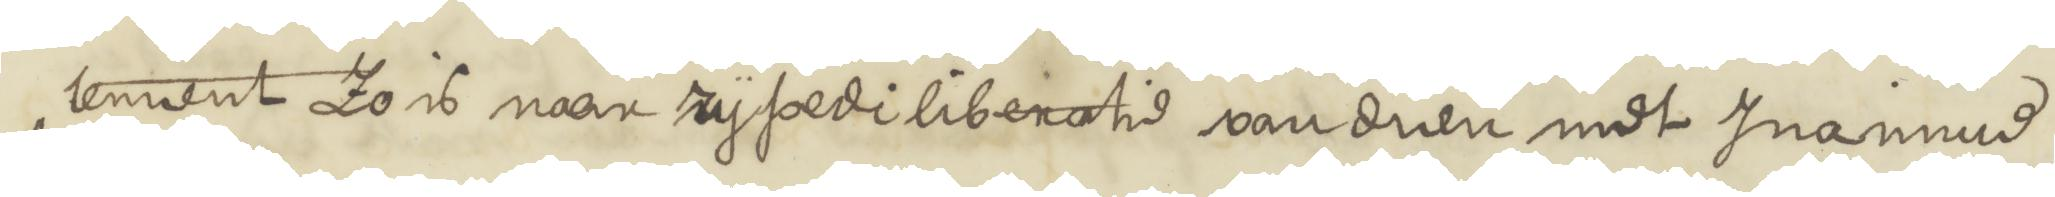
„tement zo is naar rijpe diliberatie van dien met Jnamme
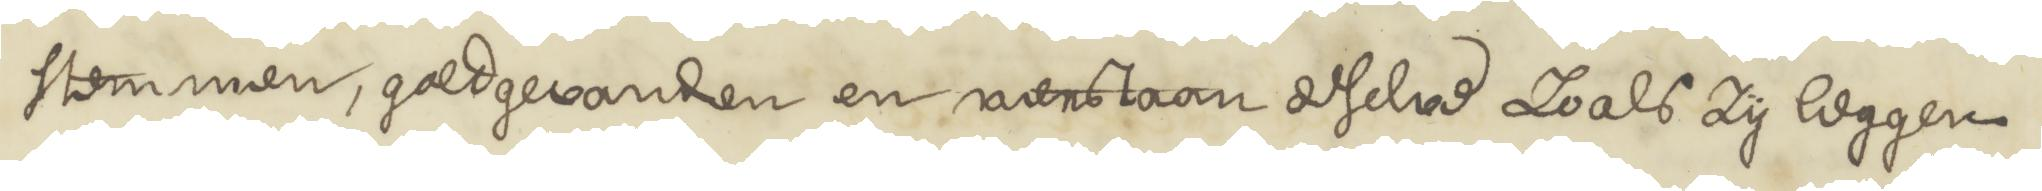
stemmen, goedgevonden en verstaan deselve zoals zij leggen
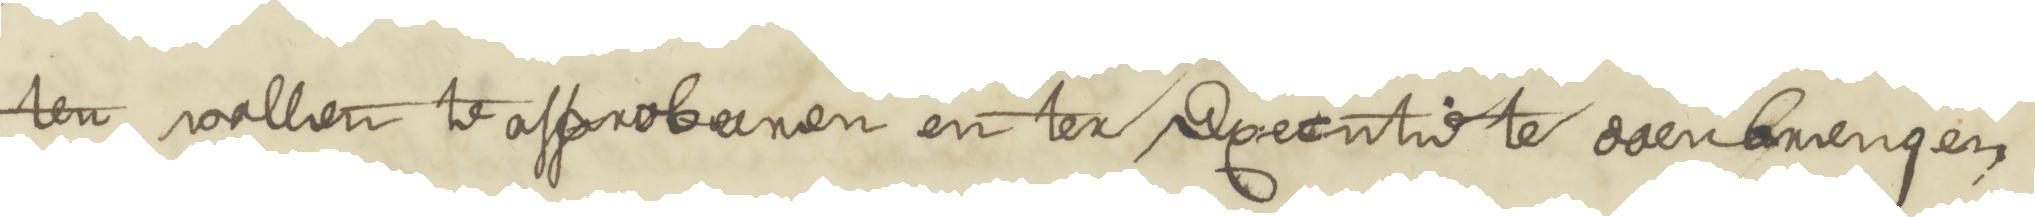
ten vallen te approberen en ter Executie te doen brengen
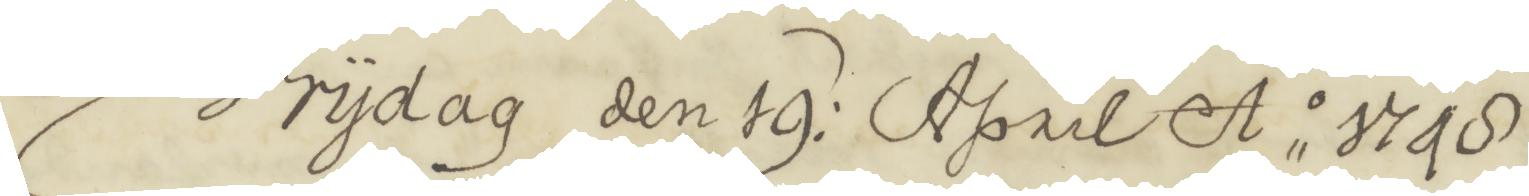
Vrijdag den 19:' April A„o 1748
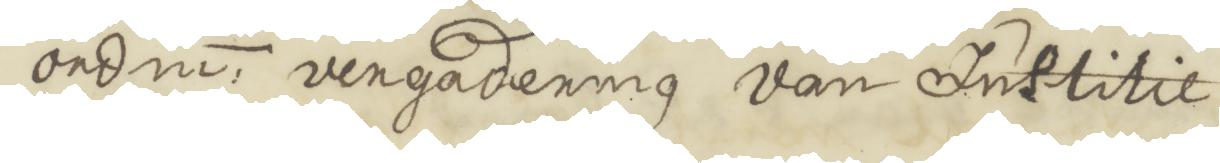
ordm: vergadering van Iustitie
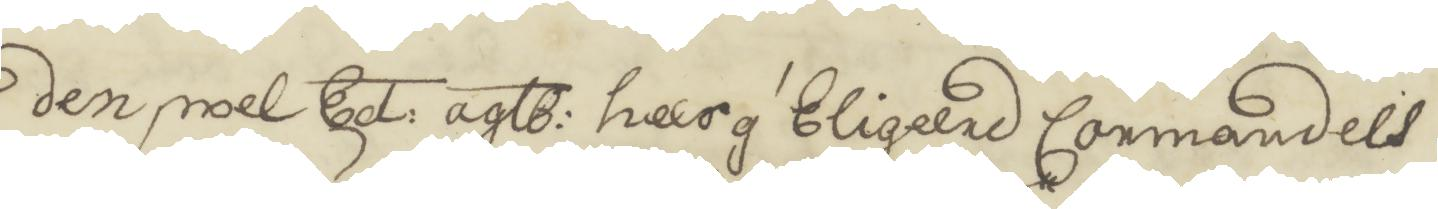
den wel Ed: agtb: heer g’Eligeerd Cormandels
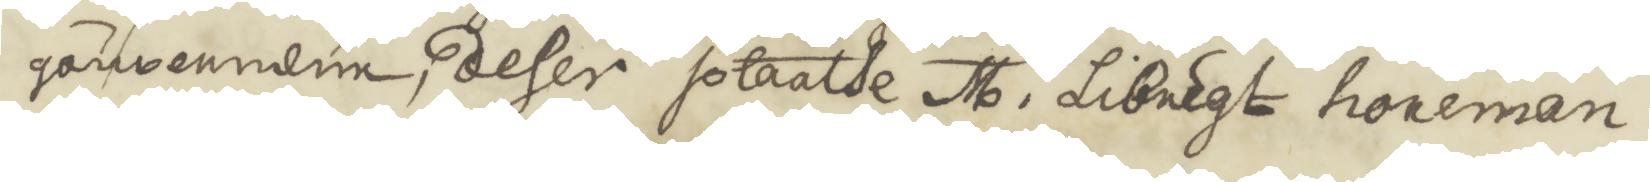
gouverneur, deser plaatse M,r Libregt horeman
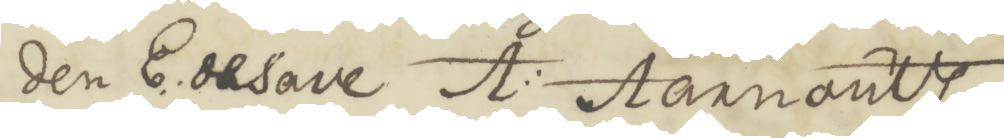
den E: desave A: Aarnoutz:
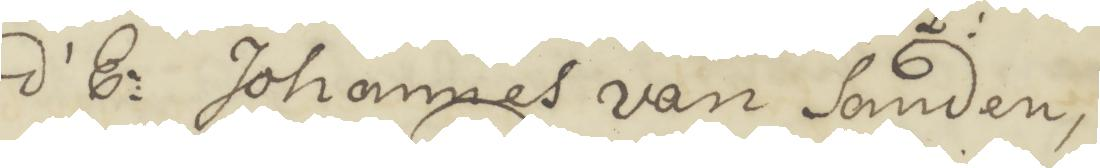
d’ E: Johannes van sanden,
